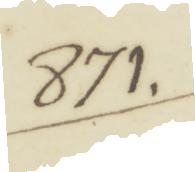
871.
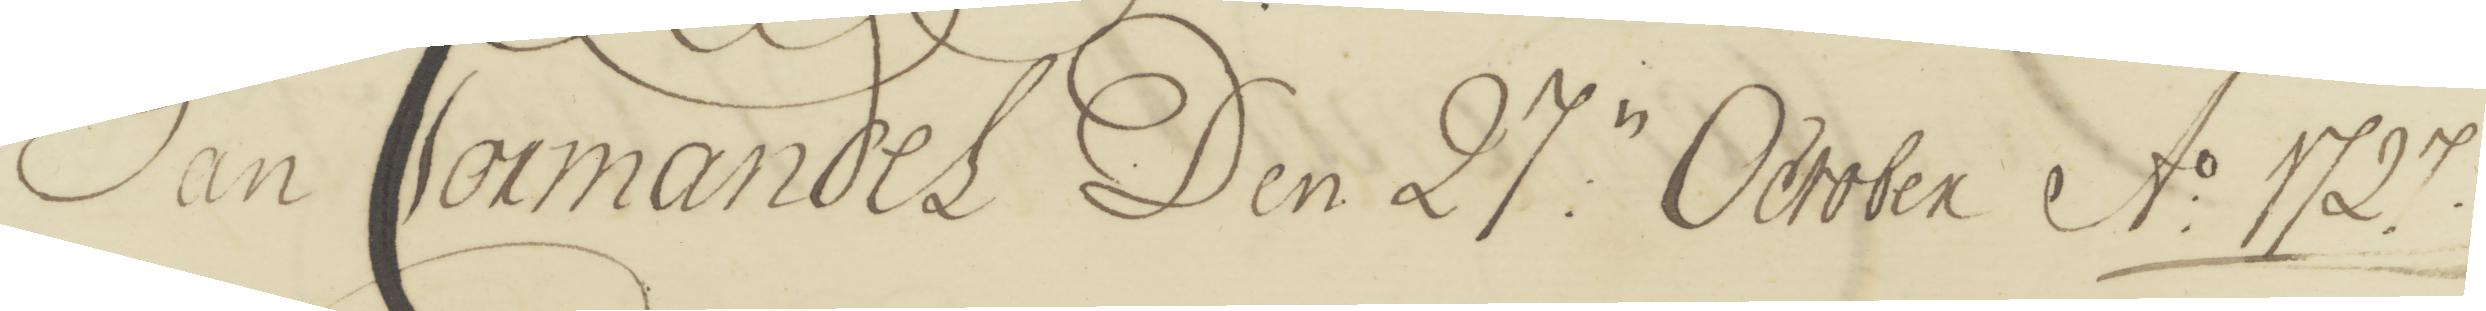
Van Cormandel Den 27:e October A:o 1727.
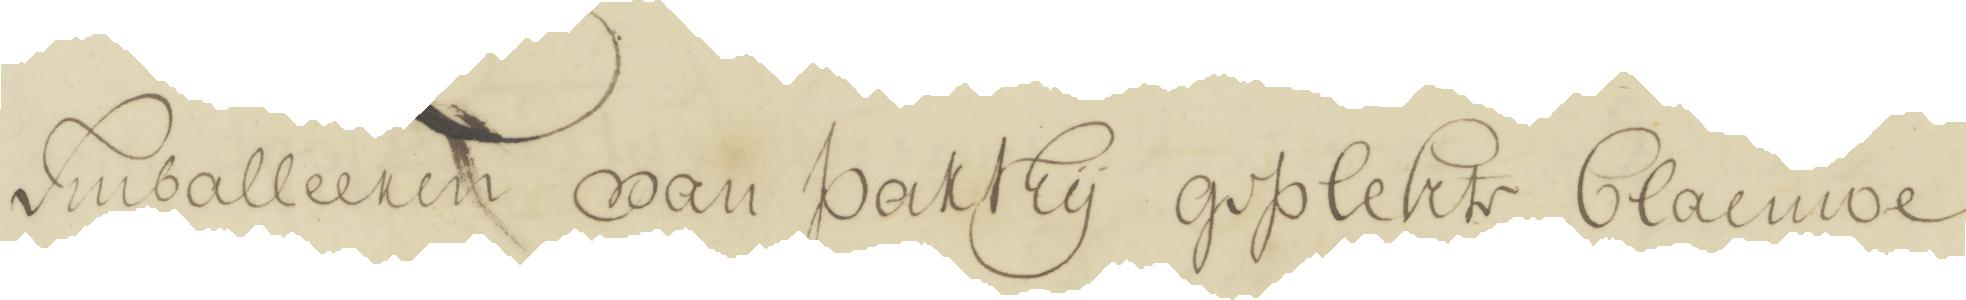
Emballeeren van parthij geplekt blaeuwe
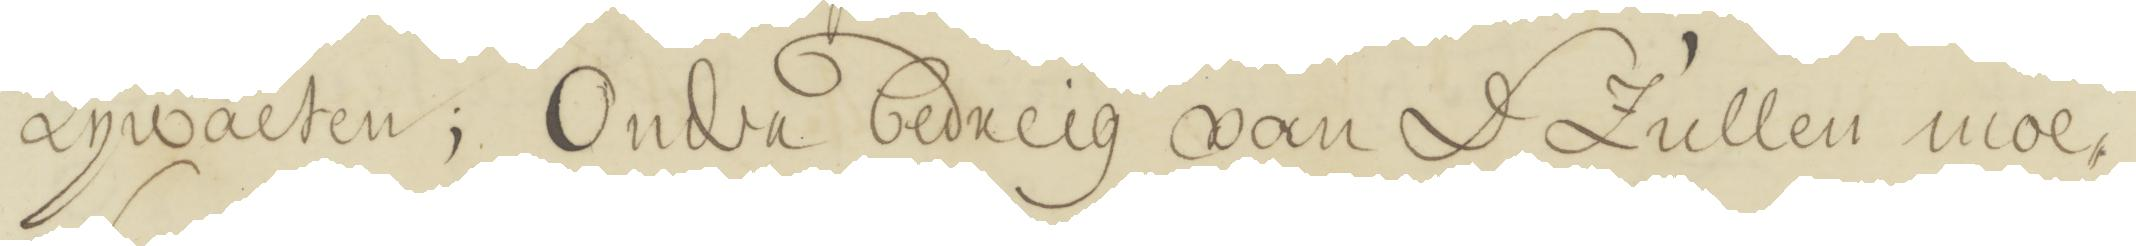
Lijwaeten; Onder bedreig van te Zullen moe„
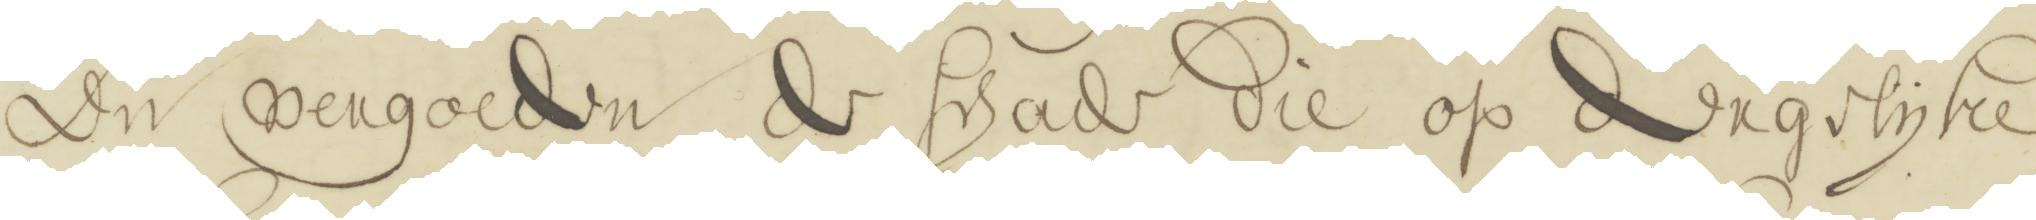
ten vergoeden de schade die op dergelijke
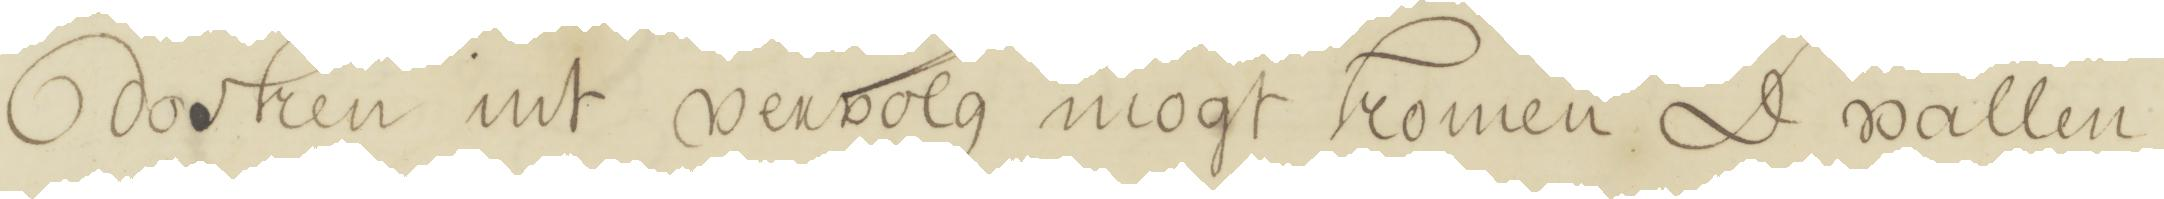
doeken int vervolg mogt komen te vallen
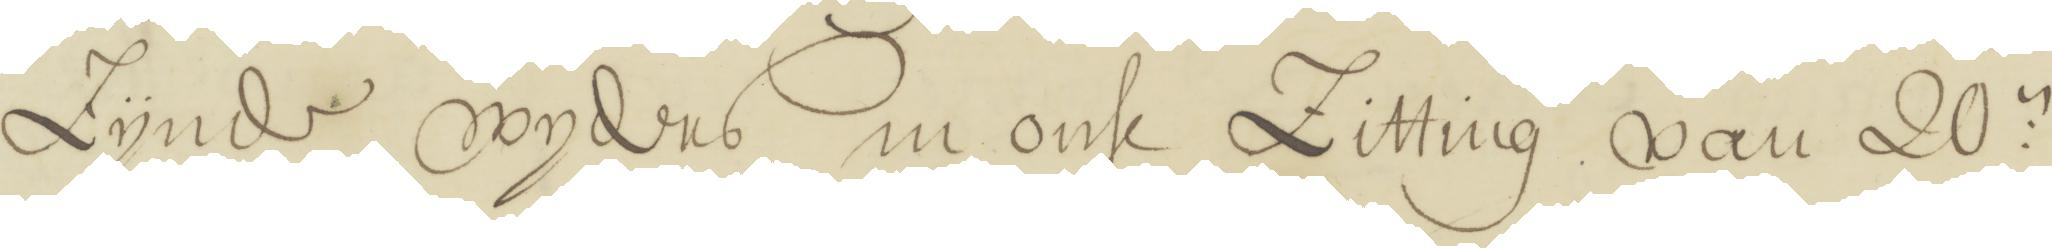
Zijnde wyders in onse Zitting van 20:n
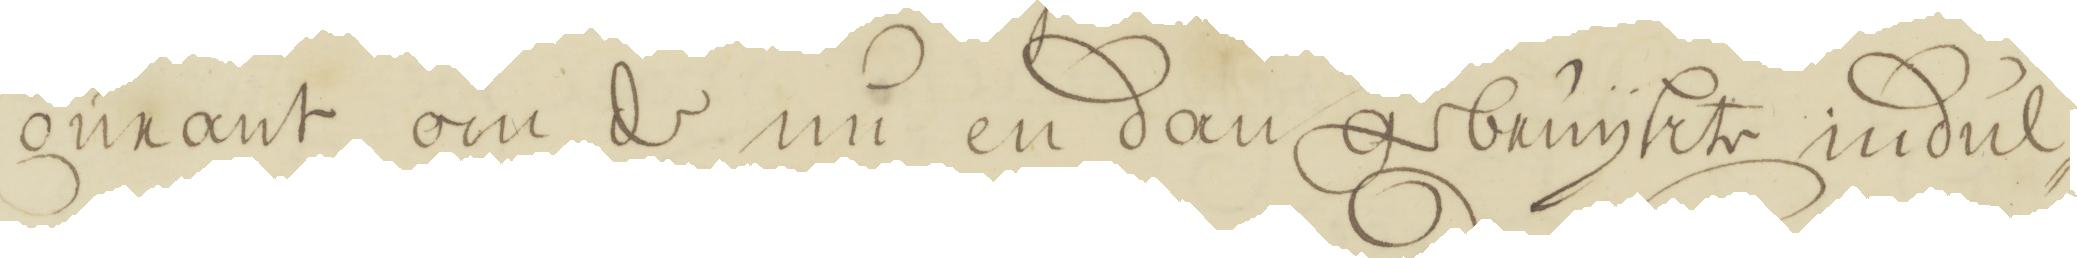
Courant om de nu en dan gebruijkte indul,
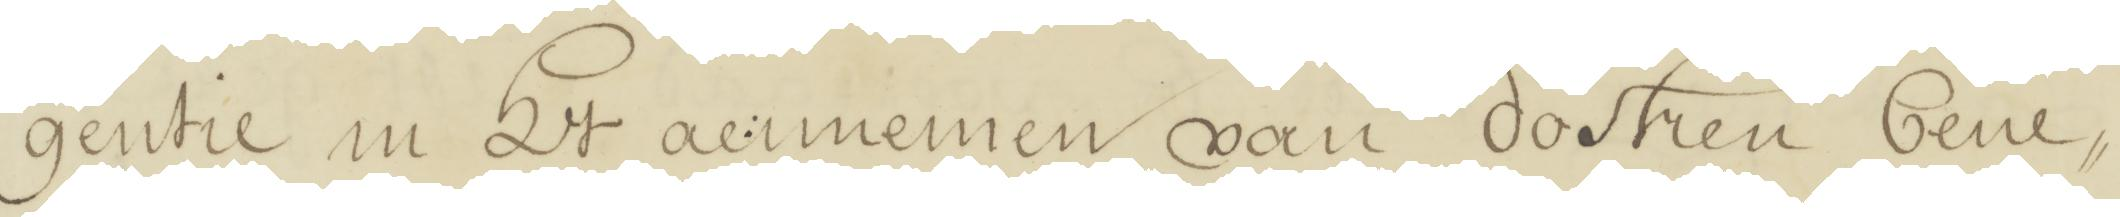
gentie in het aennemen van doeken bene„
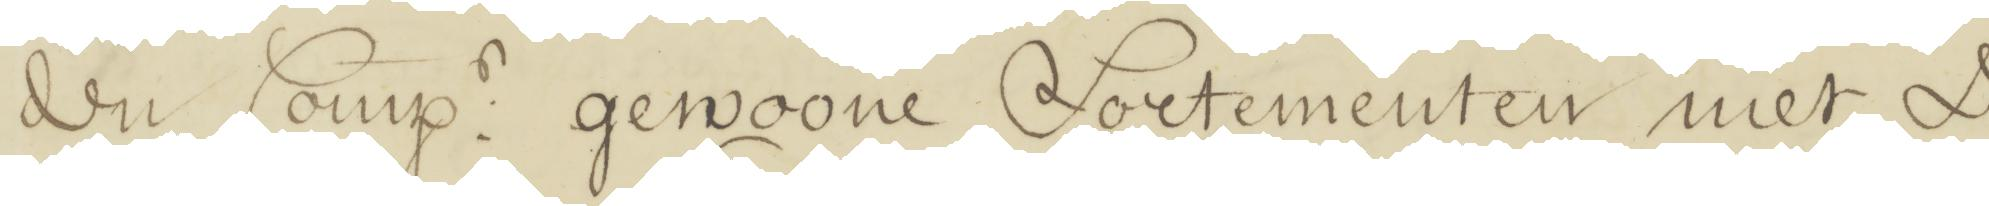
den Comp:s gewoone Sortementen niet te
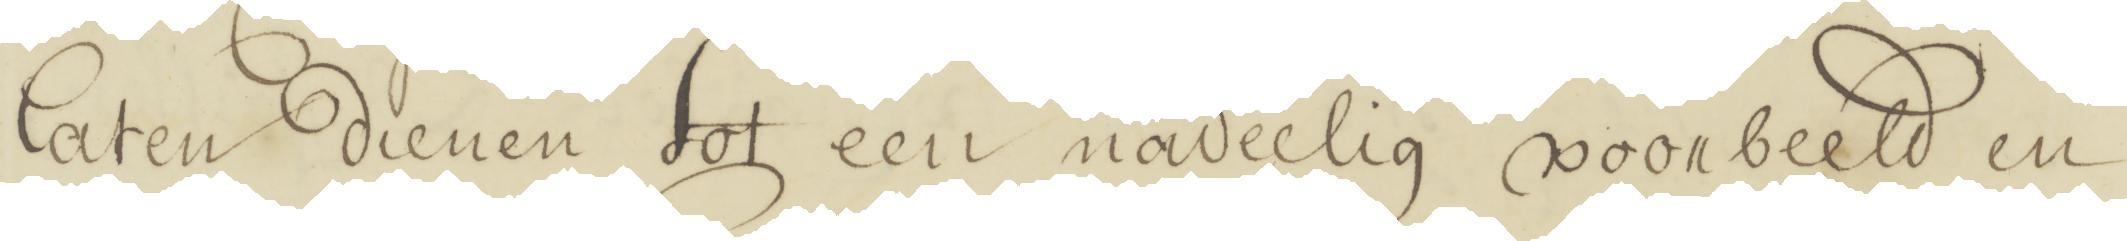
laten dienen tot een nadeelig voor beeld en
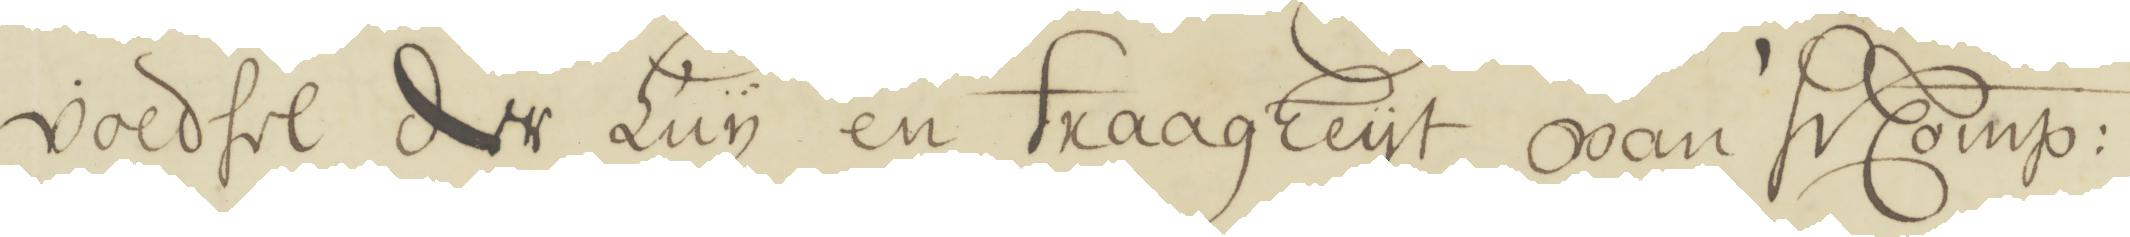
voedsel der Luij en traagheijt van 's E Comp:
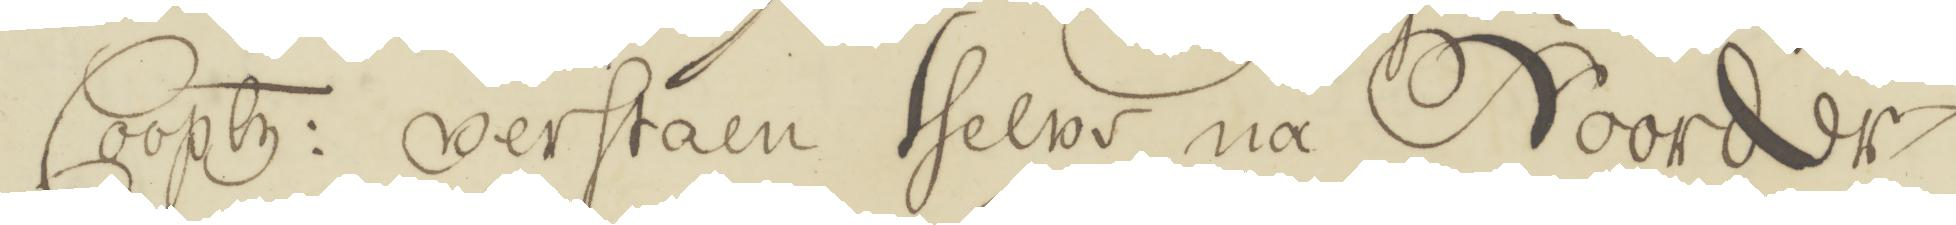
Coopln: verstaen tselve na Noorder
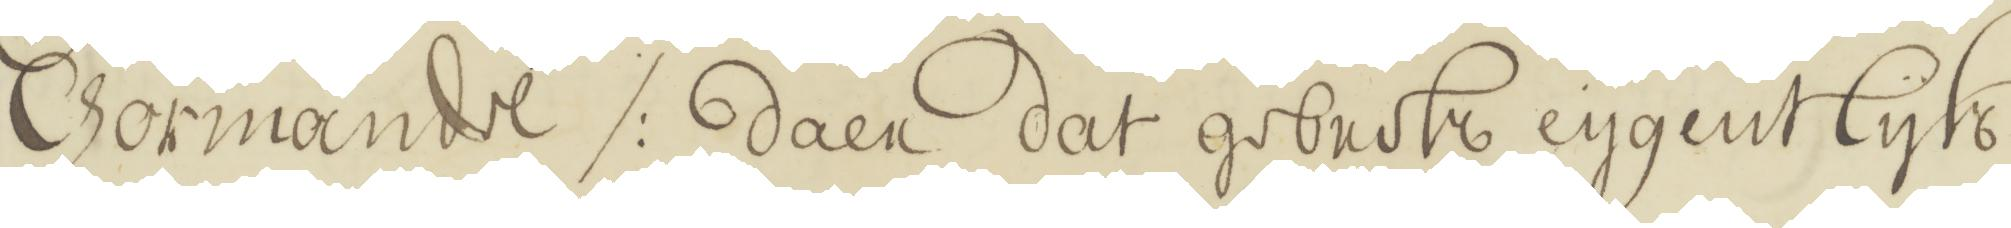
Chormandel /: daer dat gebrek eijgentlijk
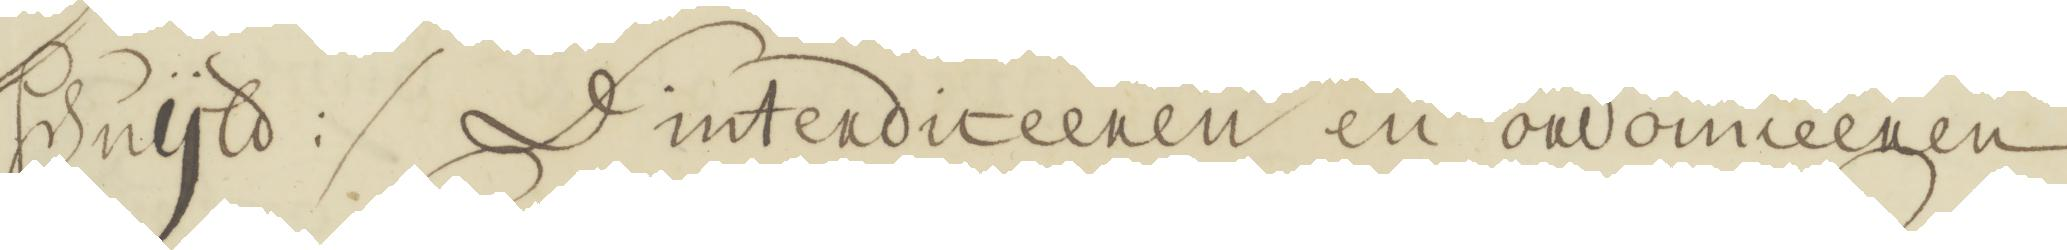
schuijld:/ te interdiceeren en ordonneeren
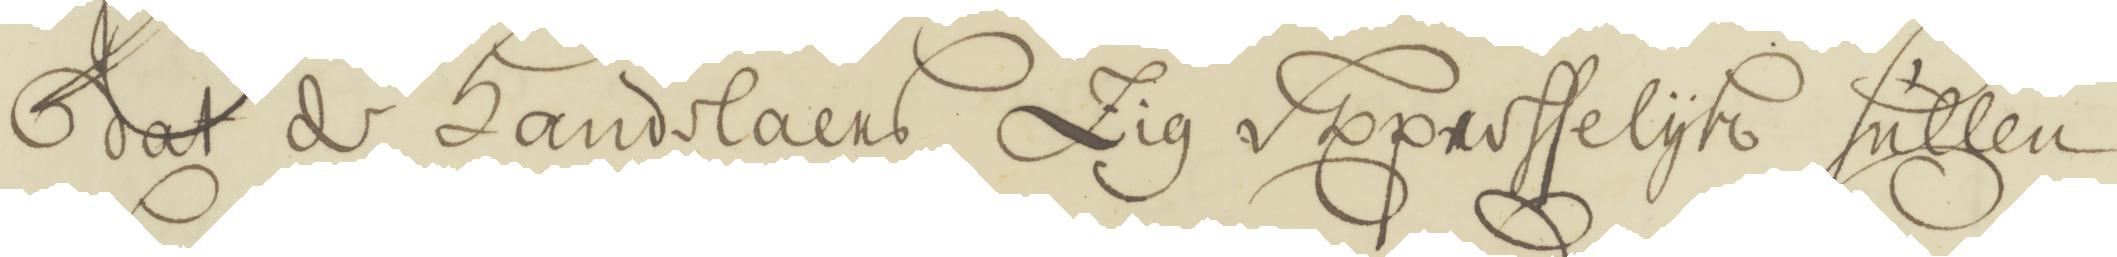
dat de handelaers Zig Expresselijk Sullen
